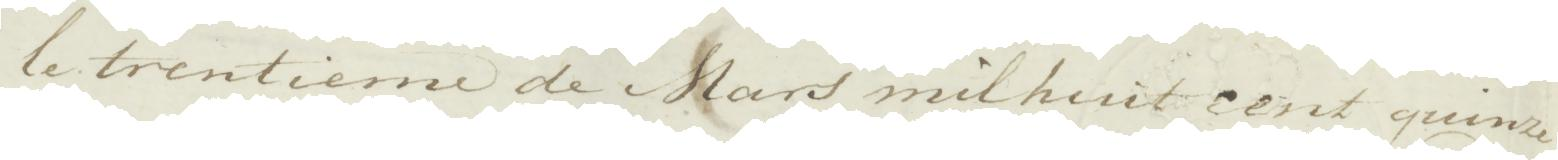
le trentieme de Mars milhuit cent quinze
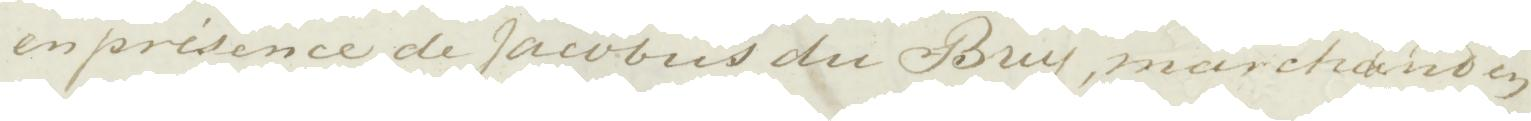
en presence de Jacobus du Buy, marchand en
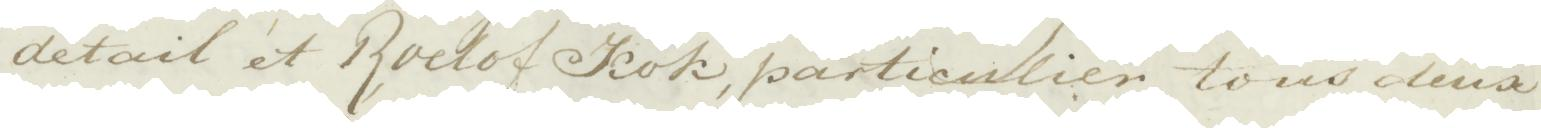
detail et Roelof Kok, particulier, tous deux
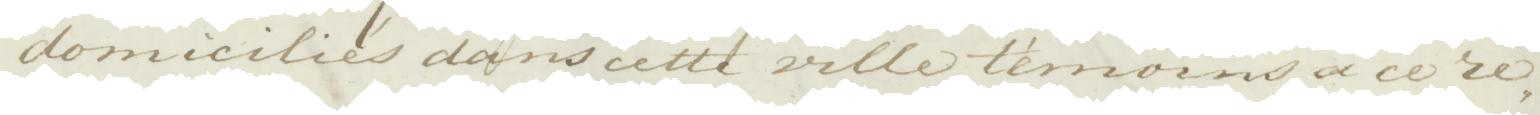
domicilies dans cette ville, temoins a ce re„
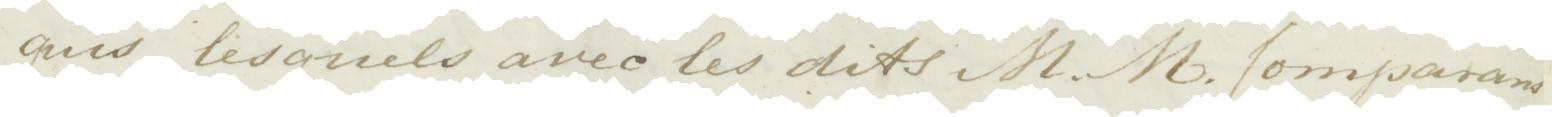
quis, lesquels avec les dits M.M. Comparans
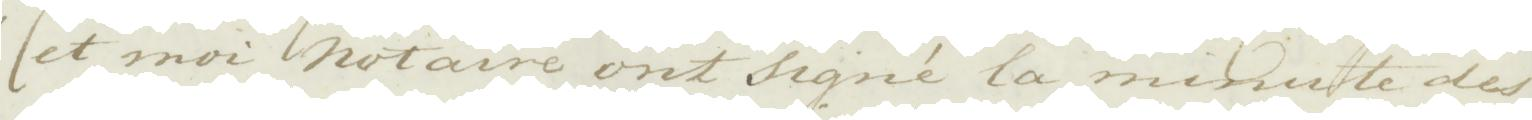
et moi notaire ont signe la minute des
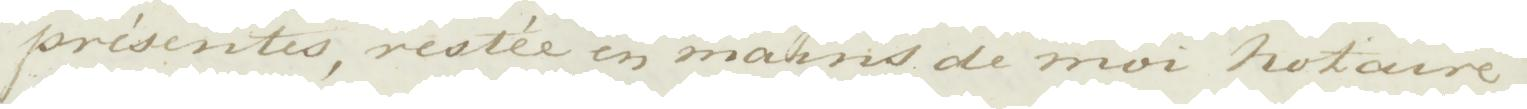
presentes, restee en mains de moi notaire
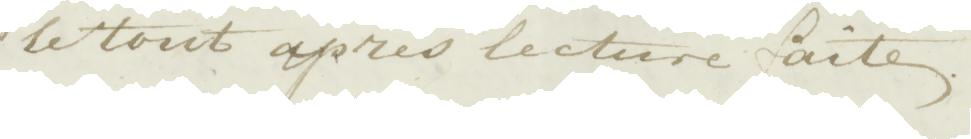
le tout apres lecture laite
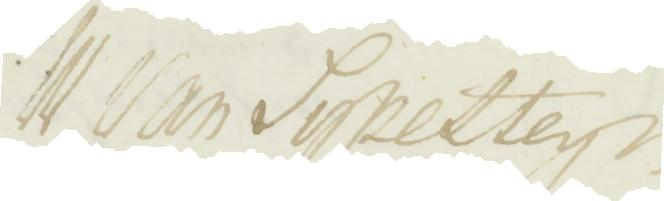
W Van Sypestein
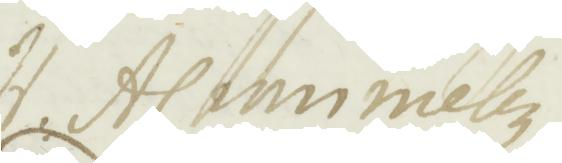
H.ACrommelin
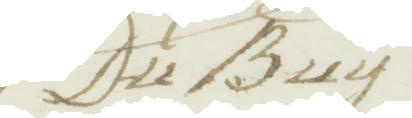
J: De Buy
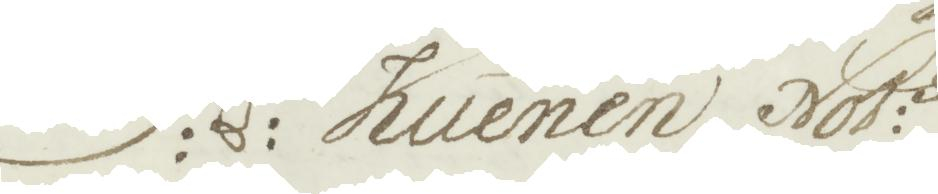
J:P: Kuenen. Not:s
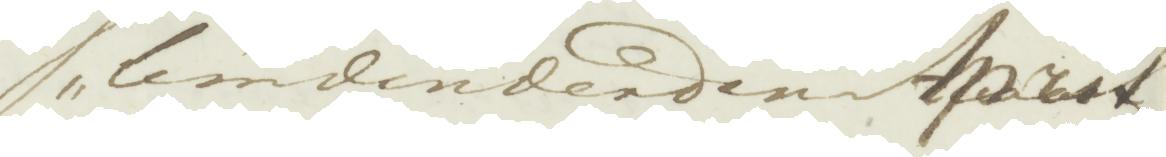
„lem den derden April
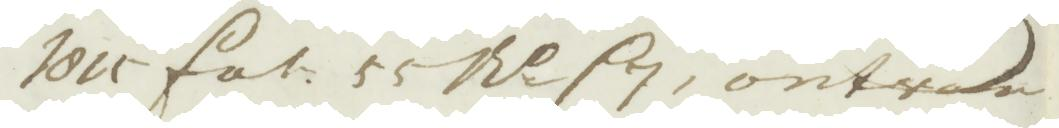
1815 fol: 55 Vr„o C7, ontvan
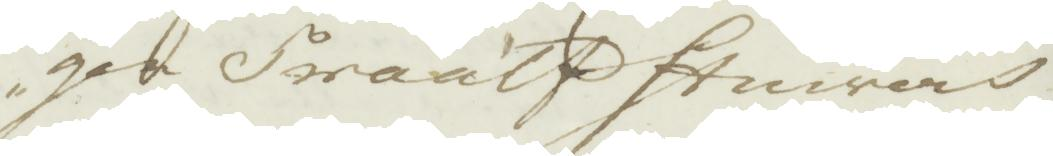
„gen Twaalf Stuivers
